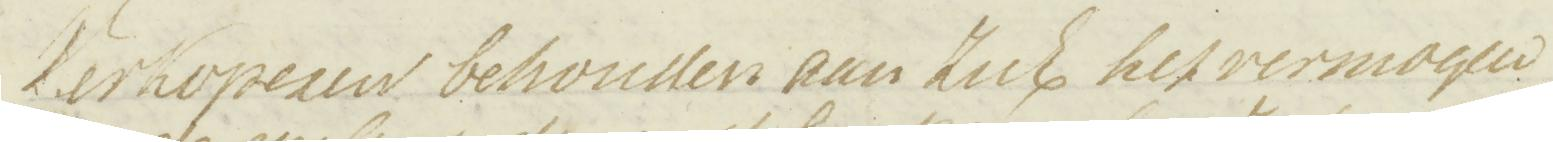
Verkoperen behouden aan zich het vermogen
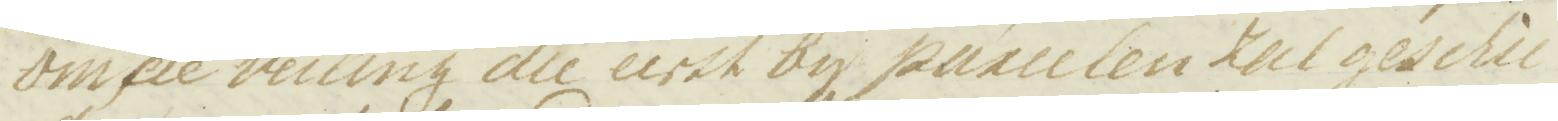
om de veiling die eerst by parcelen zal geschie
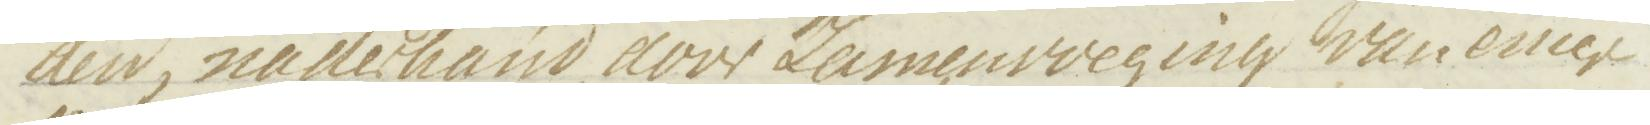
den, naderhand door Zamenvoeging van enig
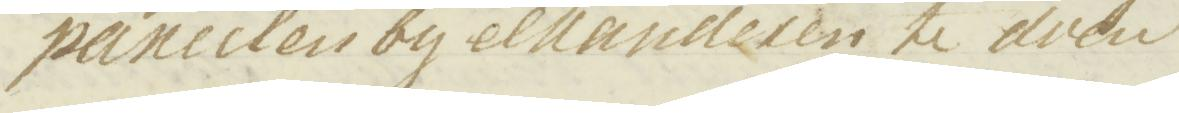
parcelen by elkanderen te doen
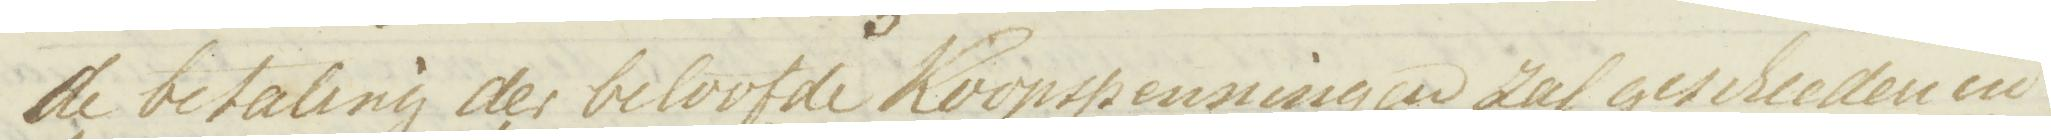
de betaling der beloofde Koopspenningen Zal geschieden in
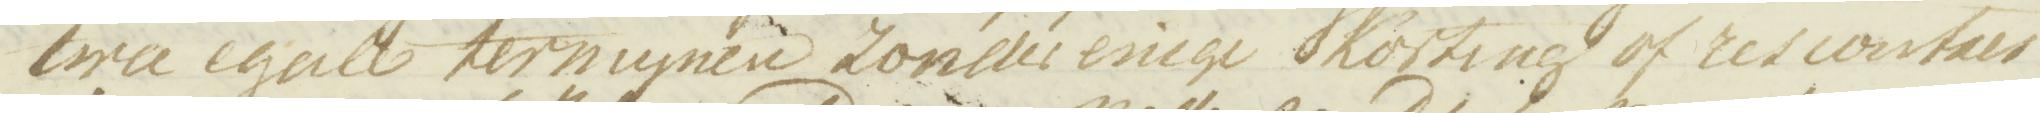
twee egale termynen zonder enige korting of rescontres
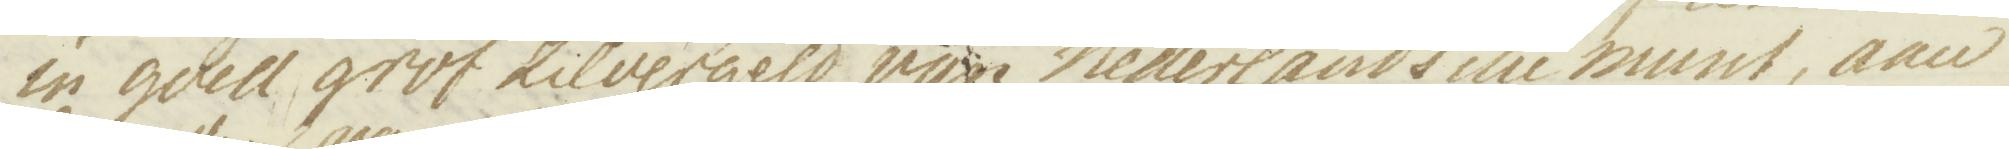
in goed grof Zilvergeld van nederlandsche munt, aan
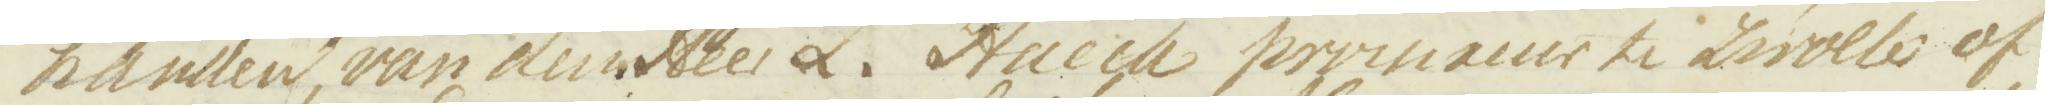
handen van den Heer L: Haeck procureur te Zwolle of
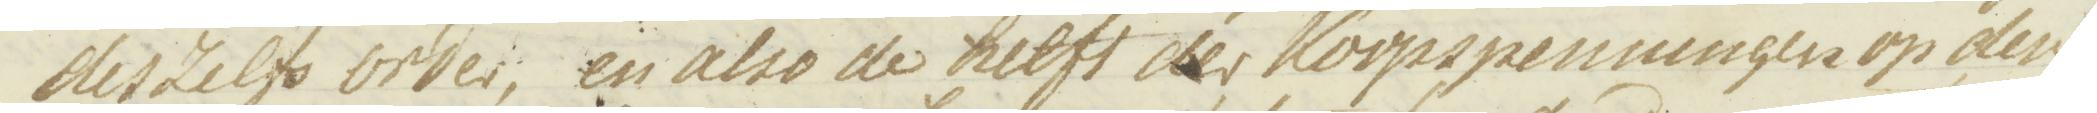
deszelfs order; en also de helft der Koopspenningen op den
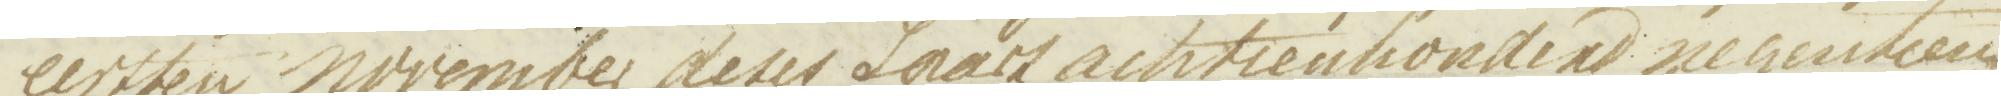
eersten november deses Iaars achtienhonderd negentien
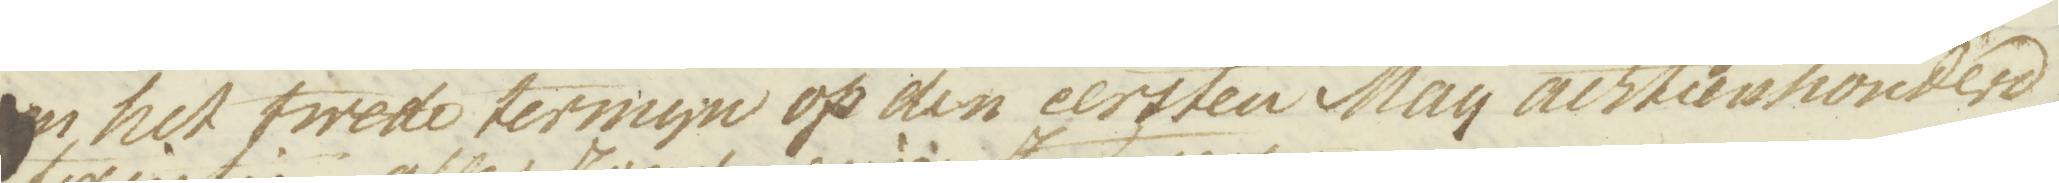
en het twede termyn op den eersten May acttienhonderd
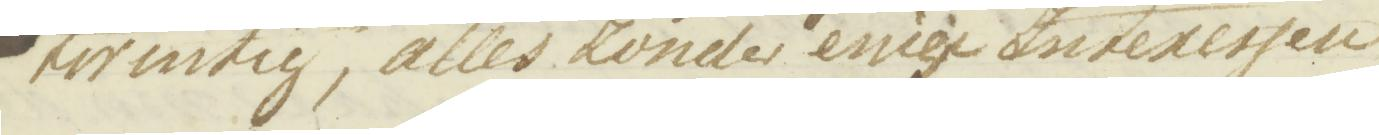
twintig, alles zonder enige Interessen
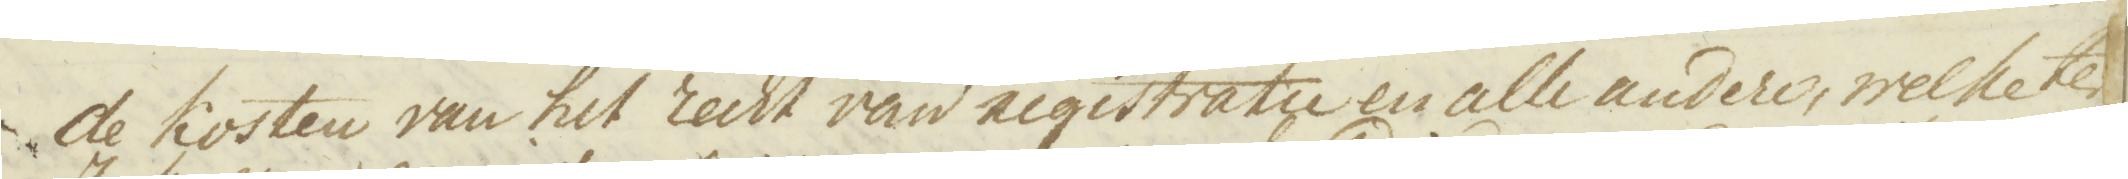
de kosten van het recht van registratie en alle andere, welke te
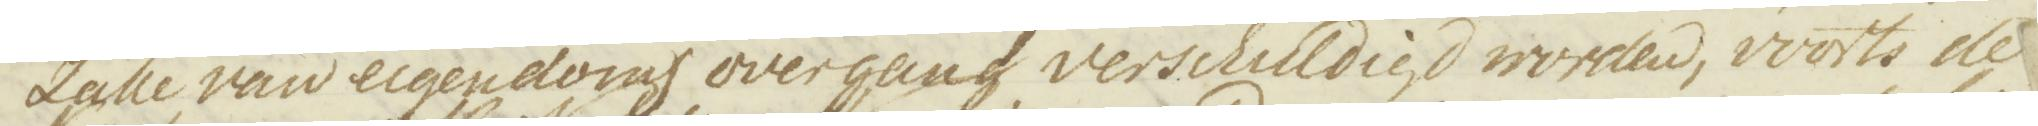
Zake van eigendoms overgang verschuldigd worden, voorts de
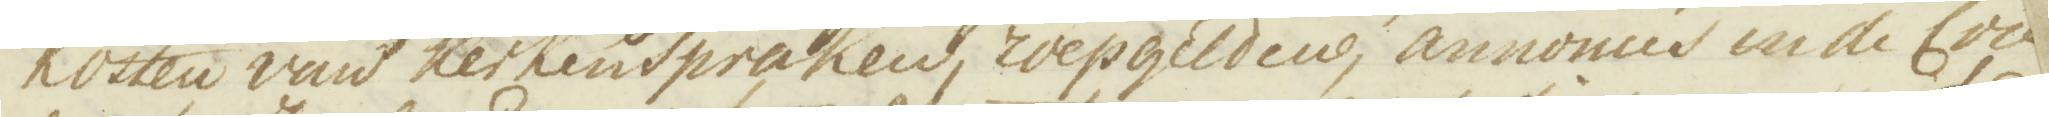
Kosten van Kerkenspraken, roepgelden, annonces in de Cou
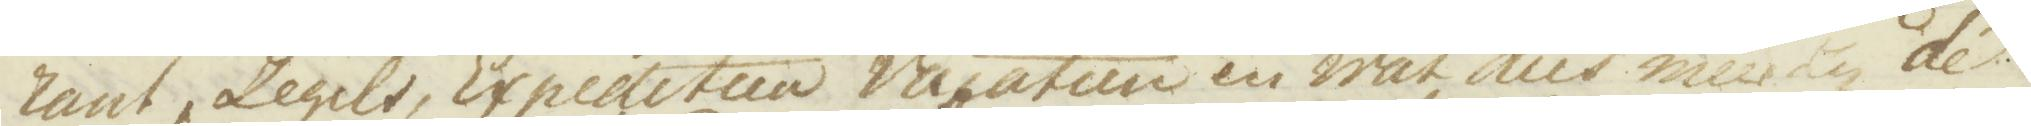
rant, Zegels, Expeditien Vacatien en wat dus meer zy de
